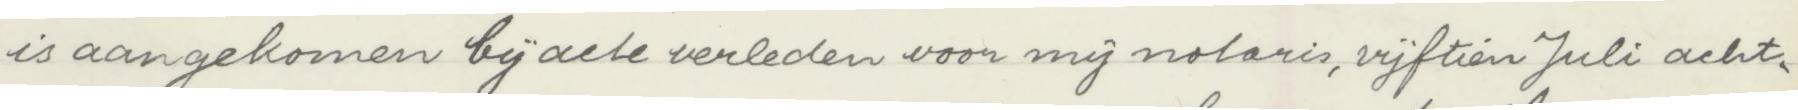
is aangekomen bij acte verleden voor mij notaris, vijftien Juli acht„
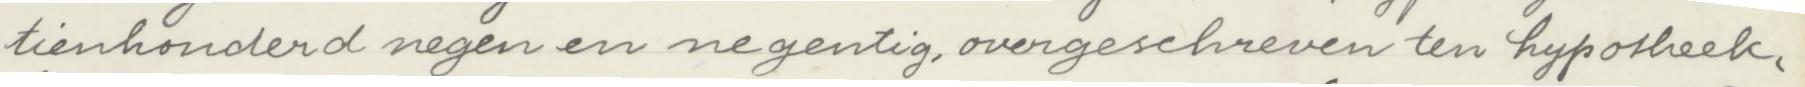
tienhonderd negen en negentig, overgeschreven ten hypotheek„
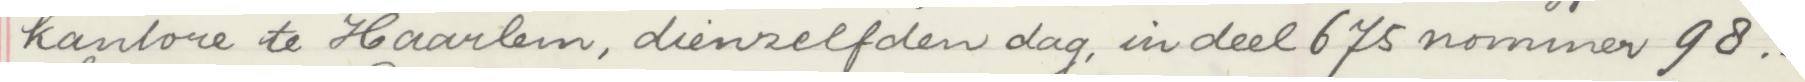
kantore te Haarlem, dienzelfden dag, in deel 675 nommer 98. -
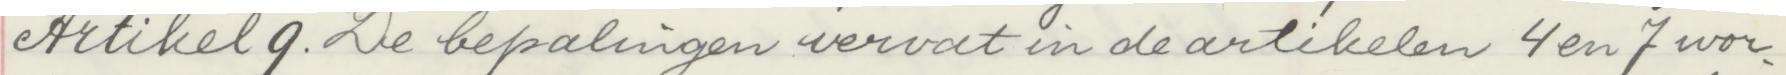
Artikel 9. De bepalingen vervat in de artikelen 4 en 7 wor-
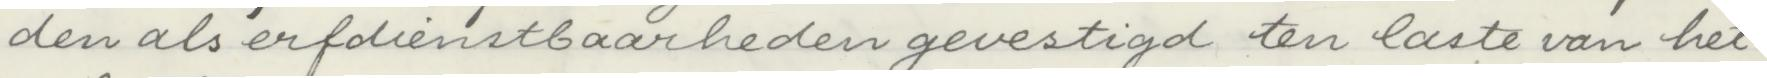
den als erfdienstbaarheden gevestigd ten laste van het
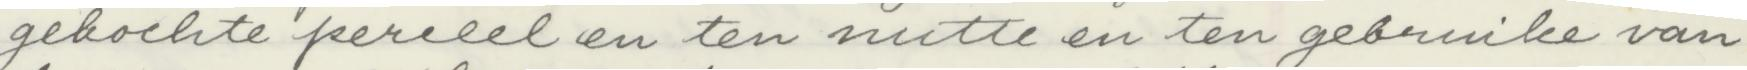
gekochte perceel en ten nutte en ten gebruike van
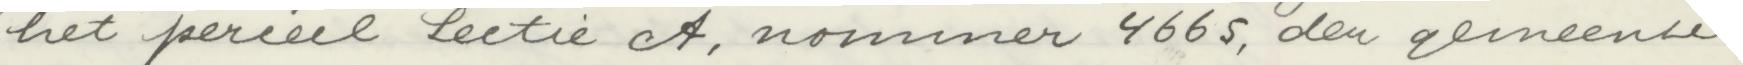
het perceel sectie A, nommer 4665, der gemeente
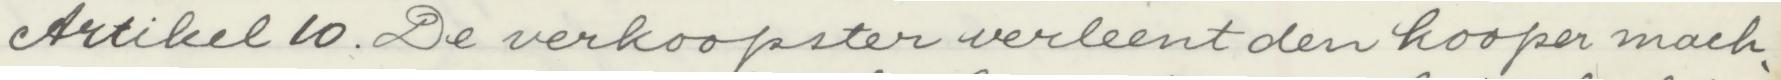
Artikel 10. De verkoopster verleent den kooper mach
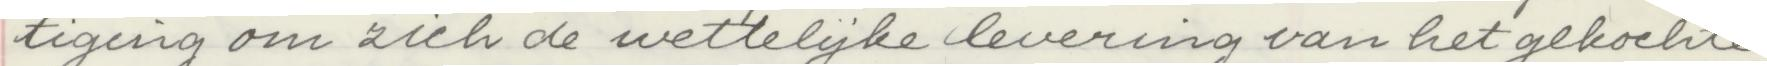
tiging om zich de wettelijke levering van het gekochte
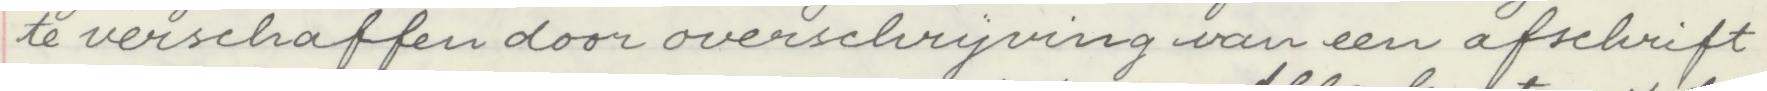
te verschaffen door overschrijving van een afschrift
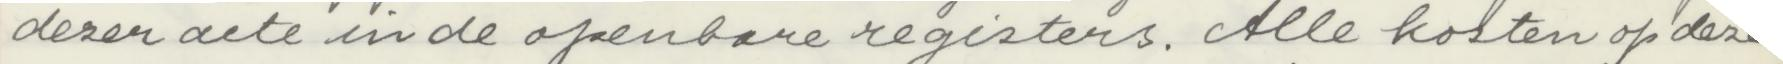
dezer acte in de openbare registers. Alle kosten op deze
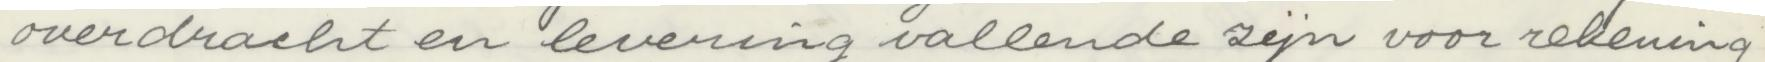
overdracht en levering vallende zijn voor rekening
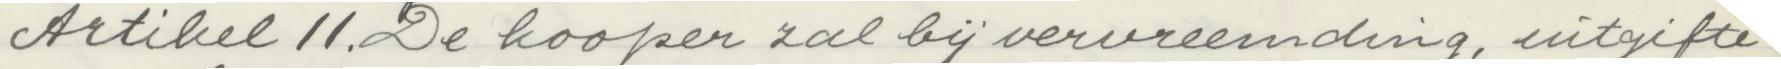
Artikel 11. De kooper zal bij vervreemding, uitgifte
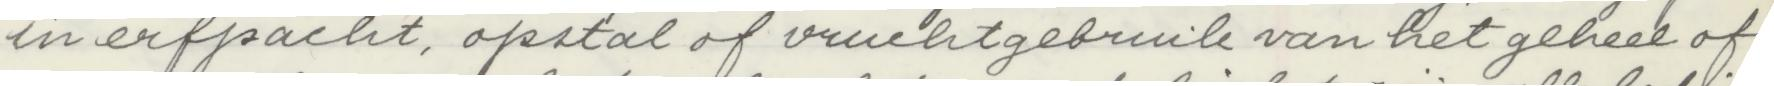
in erfpacht, opstal of vruchtgebruik van het geheel of
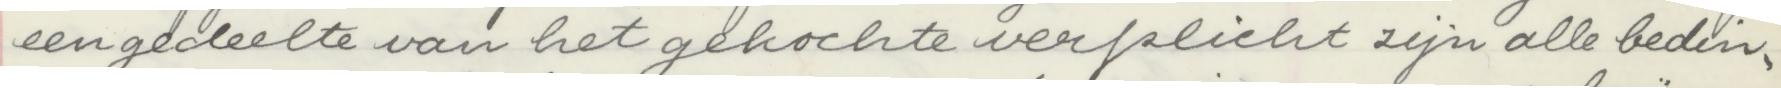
een gedeelte van het gekochte verplicht zijn alle bedin„
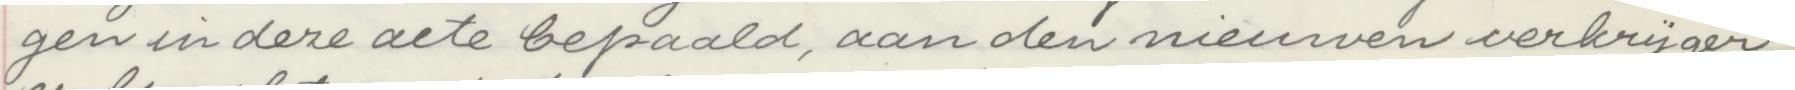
gen in deze acte bepaald, aan den nieuwen verkrijger,
